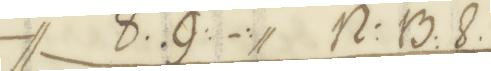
„ 8: 9: —: „ 12: 13: 8:
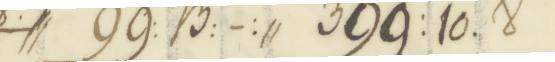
„ 99: 13: —: „ 399: 10: 8
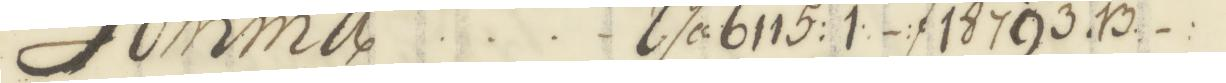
Somma r:o/a 6115: 1: —: ƒ 18793: 13: —:
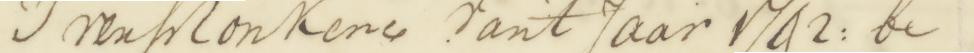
'T verschonkene van't Jaar 1742: be
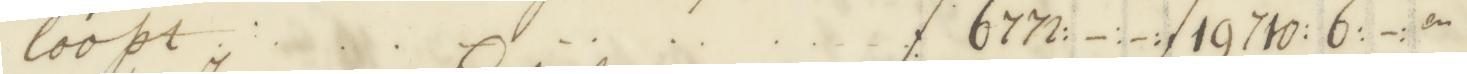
loopt . . . . . . . . . . . . . ƒ 6772: —: —: ƒ 19710: 6: —: en
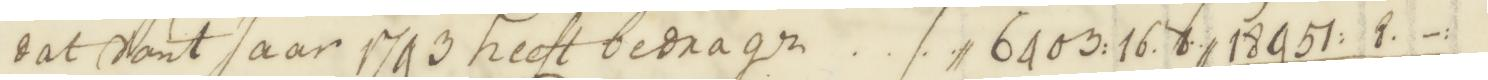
dat van't Jaar 1743 heeft bedragen . . . . . „ 6403: 16: 8: „ 18451: 8: —:
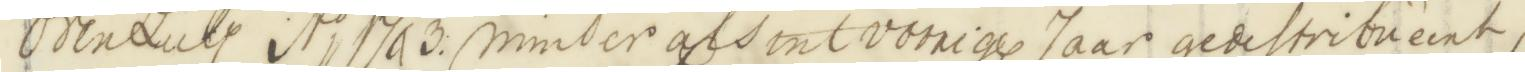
Overzulx A„o 1743: minder als in't voorige Jaar gedistribueert
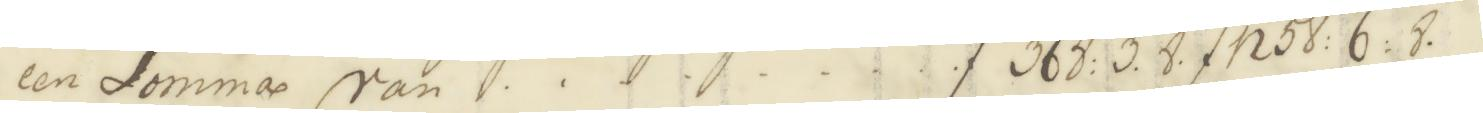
een Somma van . . . . . . . . . . ƒ 368: 3: 8: ƒ 1258: 6: 8:
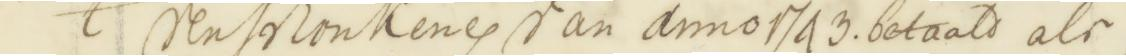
't verschonkene van anno 1743. betaald als
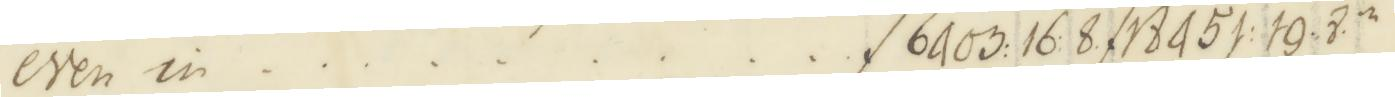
even in . . . . . . . . . . . ƒ 6403: 16: 8: ƒ 18451: 19: 8: '
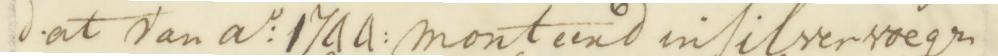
dat van a:o 1744: monteerd in silver voegen
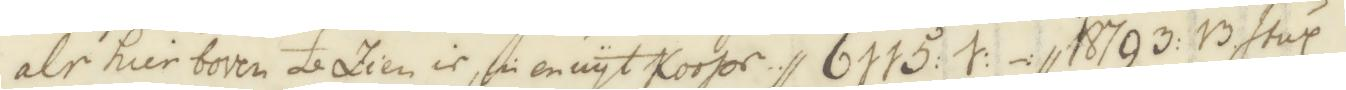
als hier boven te zien is, in en uijtkoops . .„ 6115: 1: —: „ 18793: 13: stux
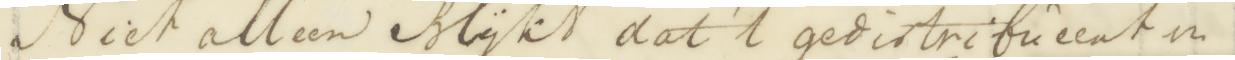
Niet alleen Blijkt dat 't gedistribueert in
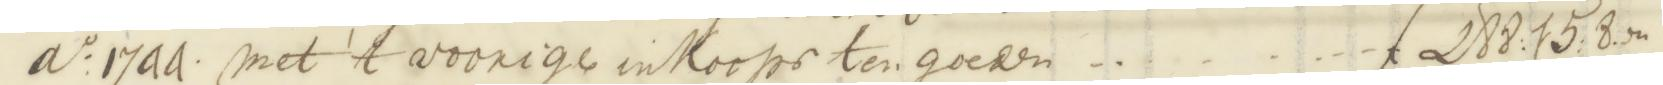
a:o 1744: met 't voorige inkoops ten goeden . . . . . . .ƒ 288: 15: 8: en
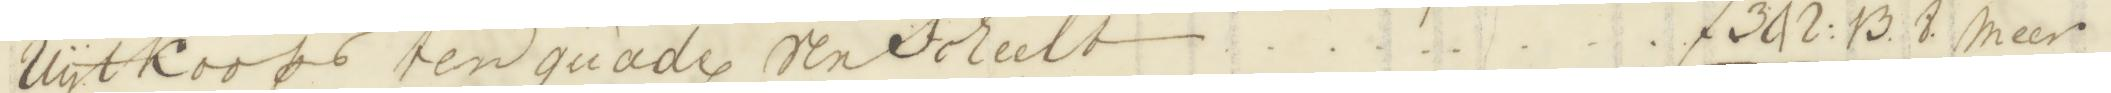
uijtkoops ten quade verscheelt . . . . . . . . . . ƒ 342: 13: 8: meer
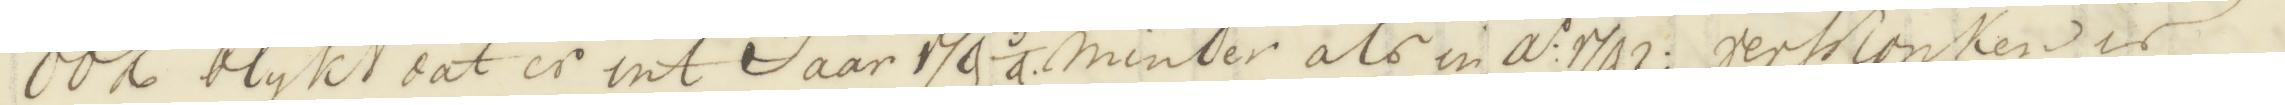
ook blijkt dat er in't Jaar 1743/4. minder als in a:o 1742: verschonken is
